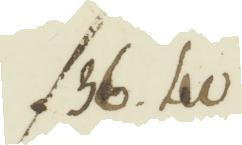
ƒ36.40
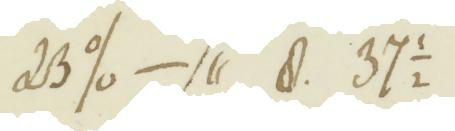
23% – „ 8. 37½
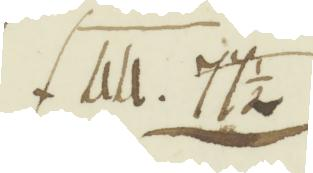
ƒ 44. 77½
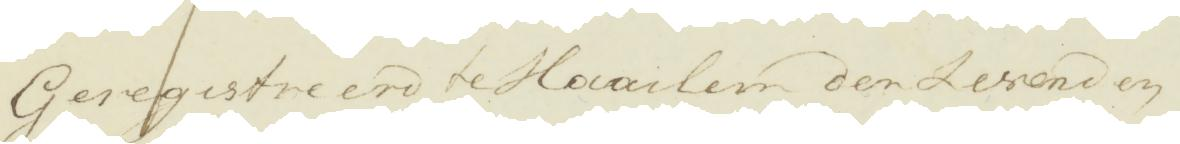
Geregistreerd te Haarlem den zevenden
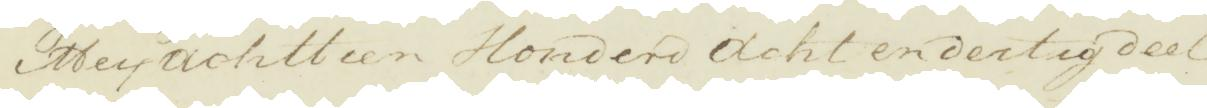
Mey achttien Honderd acht en dertig deel
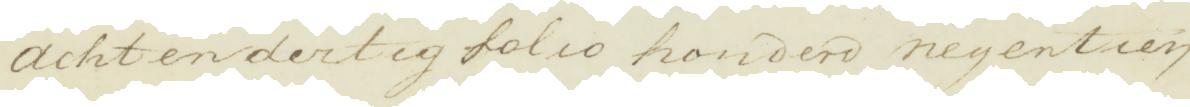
acht en dertig folio honderd negentien
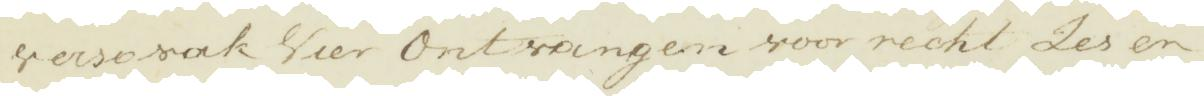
verso vak Vier ontvangen voor recht zes en
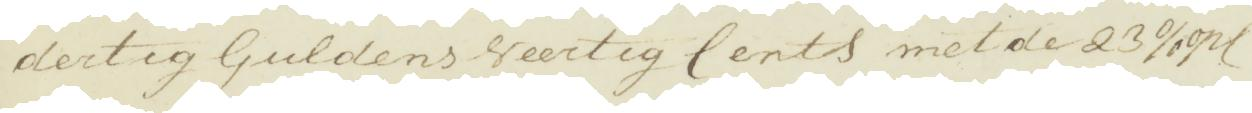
dertig Guldens Veertig Cents met de 23% opC
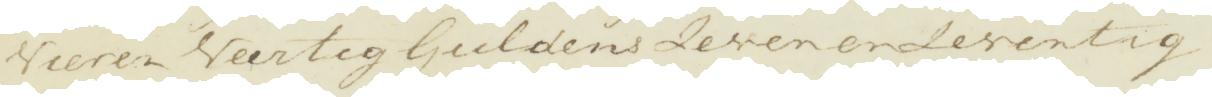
Vieren Veertig Guldens zeven en zeventig
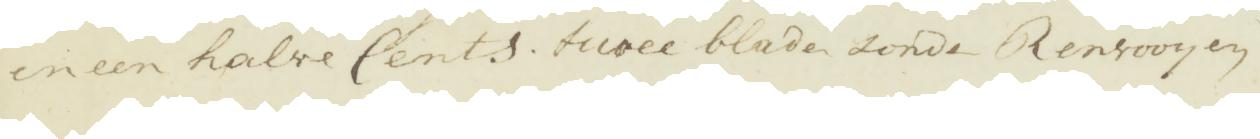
en een halve Cents. twee blade zonder Renvooyen
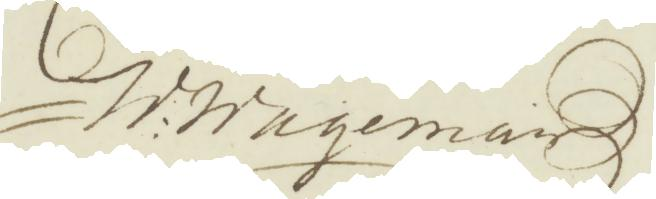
=W: Wageman
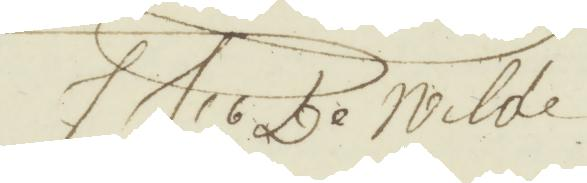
J Jb De Wilde
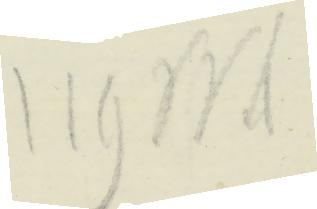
119VV4
